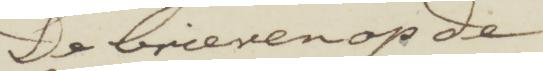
De brieven op de
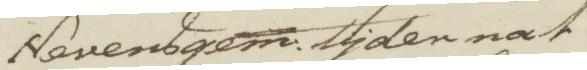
Nevensgem: tijden na t
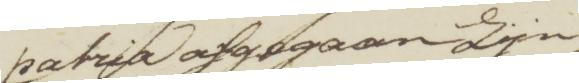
patria afgegaen zijn
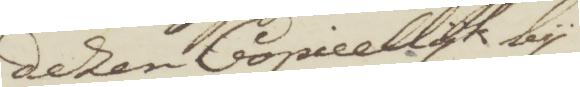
dezen Copieellijk bij
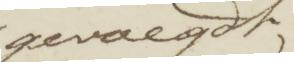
gevoegdt,
